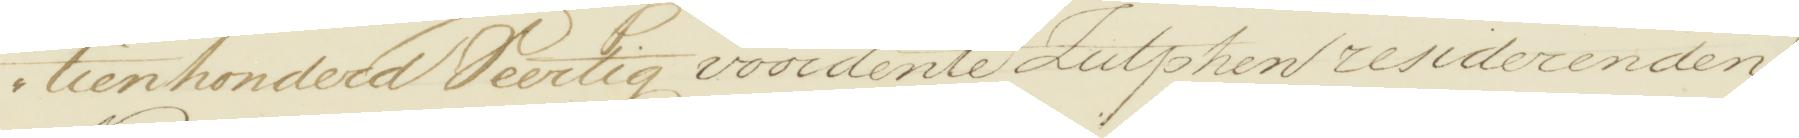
„tienhonderd Veertig voor den te Zutphen residerenden
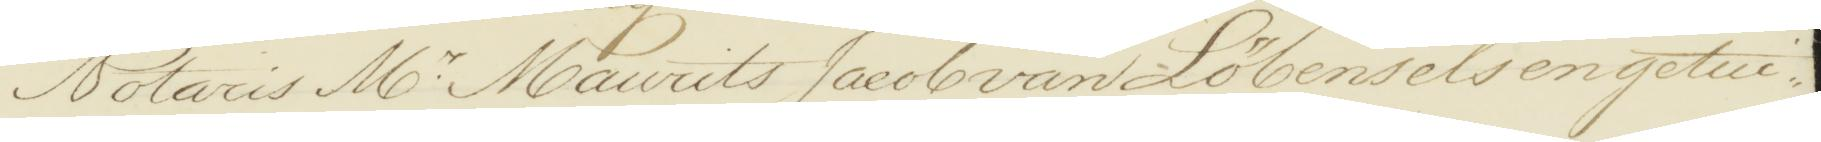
Notaris M.r Maurits Jacob van Lobensels en getui„
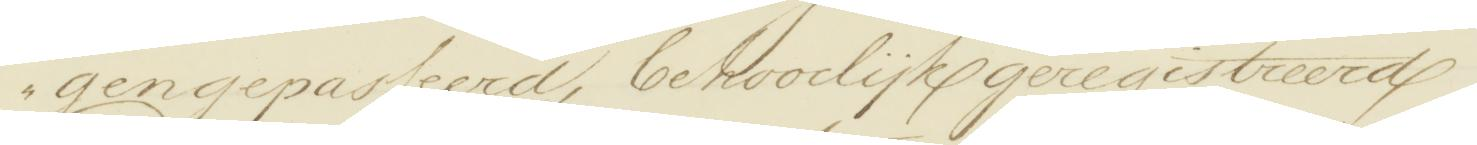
„gen gepasseerd, behoorlijk geregistreerd
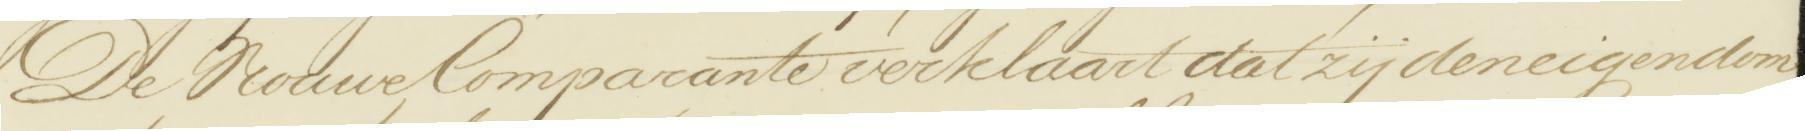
De Vrouwe Comparante verklaart dat zij den eigendom
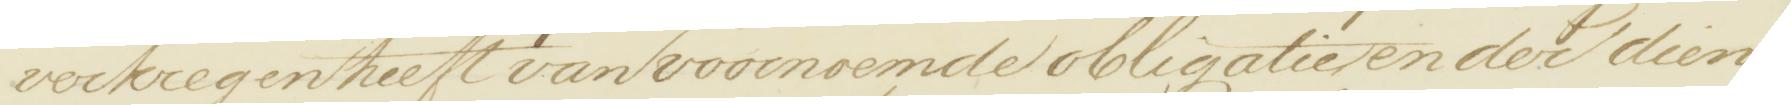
verkregen heeft van voornoemde obligatie en der dien
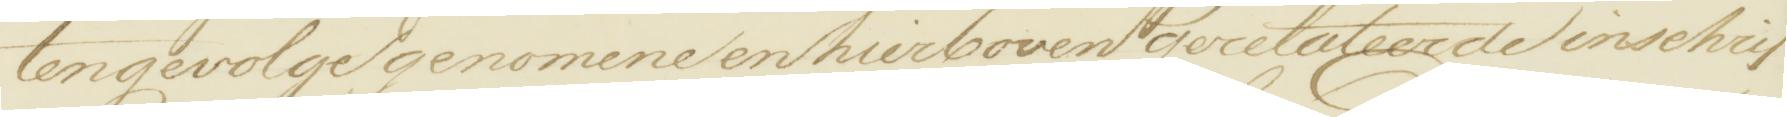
ten gevolge genomene en hierboven gerelateerde inschrij
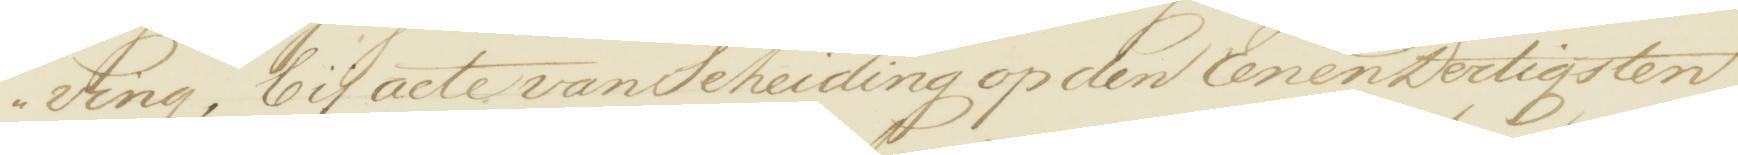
„ving bij acte van scheiding op den Eenen Dertigsten
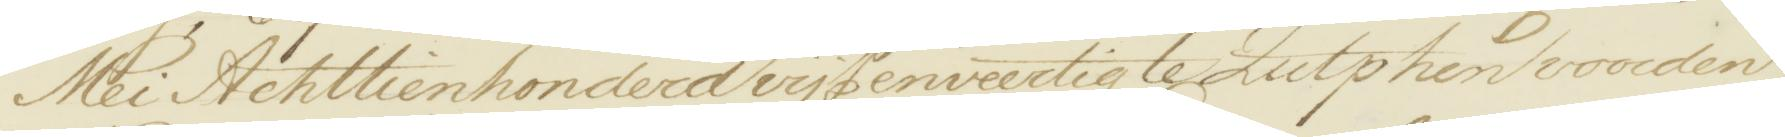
Mei Achttienhonderd vijfenveertig te Zutphen voor den
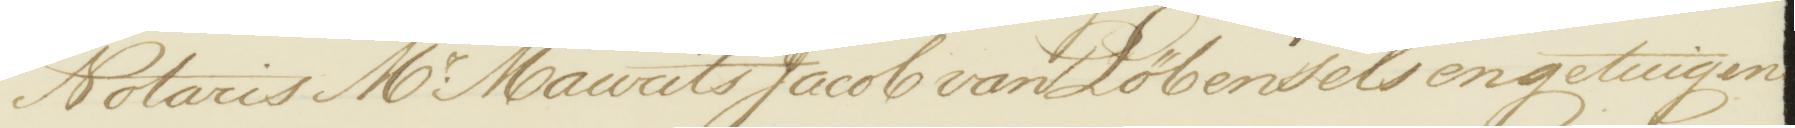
Notaris M:r Maurits Jacob van Lobensels en getuigen
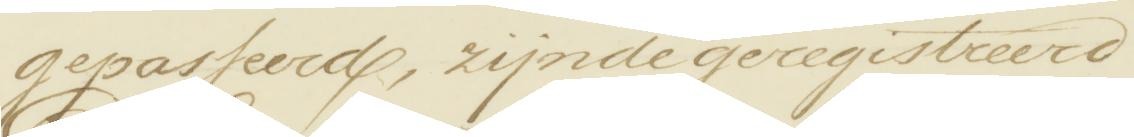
gepasseerd, zijnde geregistreerd
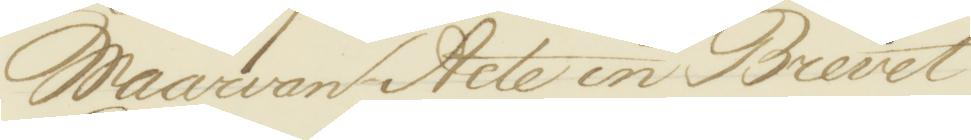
Waarvan Acte en Brevet
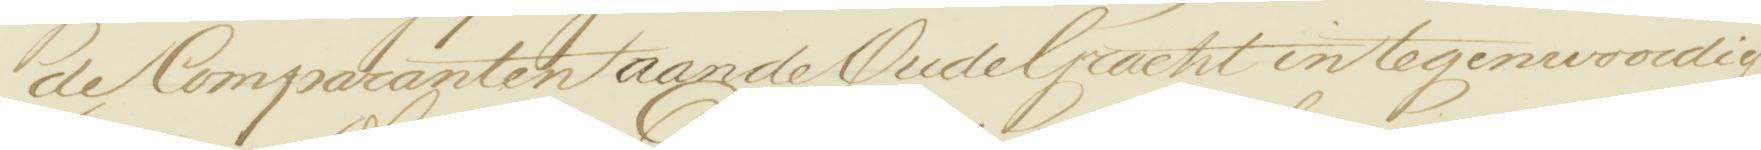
de Comparanten aan de Oude Gracht in tegenwoordig
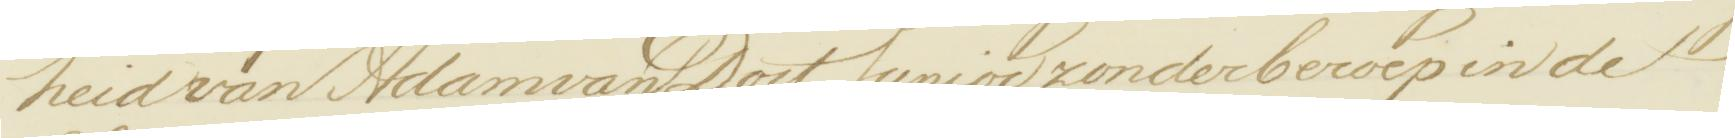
heid van Adam van Dort Junior zonder beroep in de
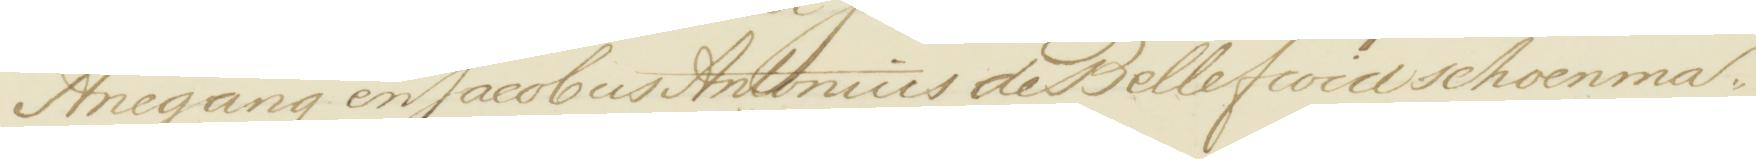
Anegang en Jacobus Antonius de Bellefoid schoenma„
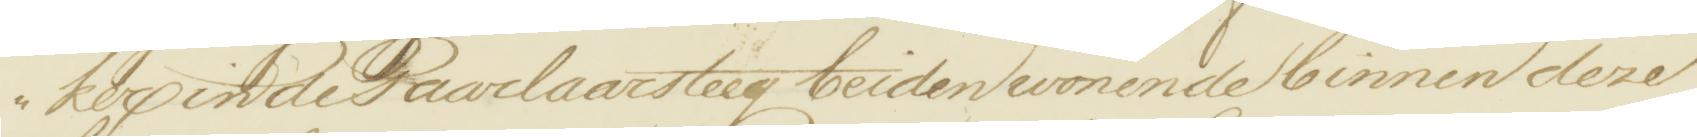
„ker in de Paarlaarsteeg beiden wonende binnen deze
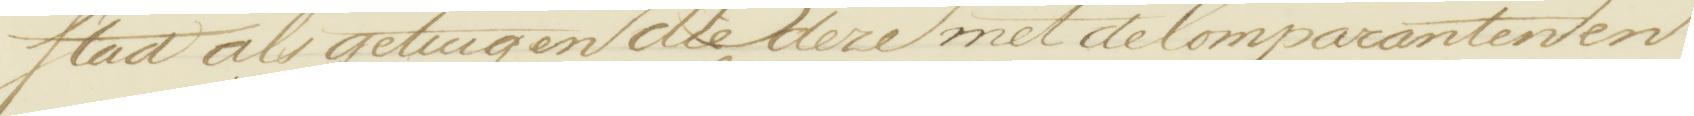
stad als getuigen die deze met de Comparanten en
